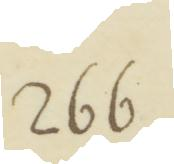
266
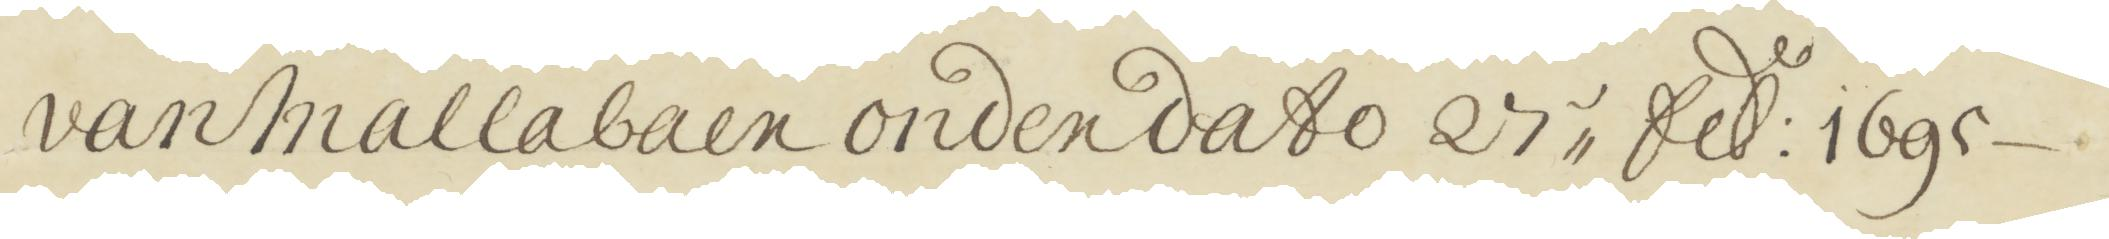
van mallabaer onder dato 27„' feb: 1695 —
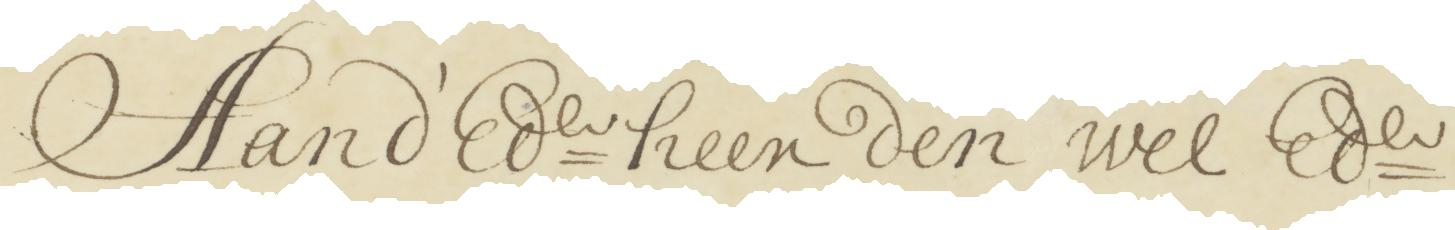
Aan d’Ed=le heer den wel Ed=le
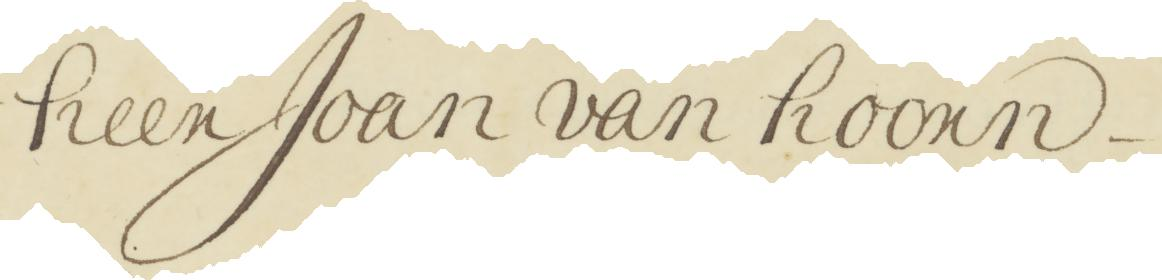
heer Joan van hoorn —
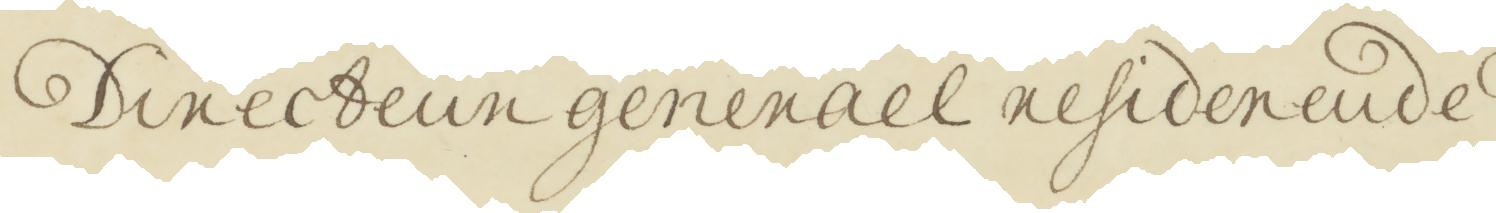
Directeur generael residerende
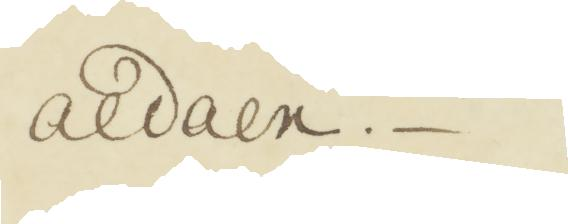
aldaer. —
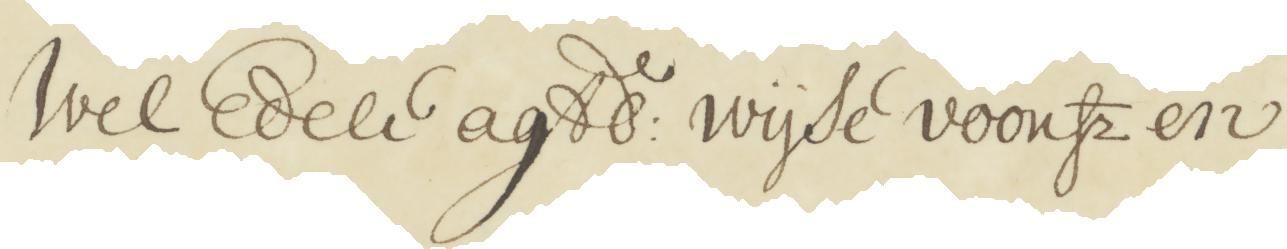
Wel Edele agtb:e wijse voorsz en
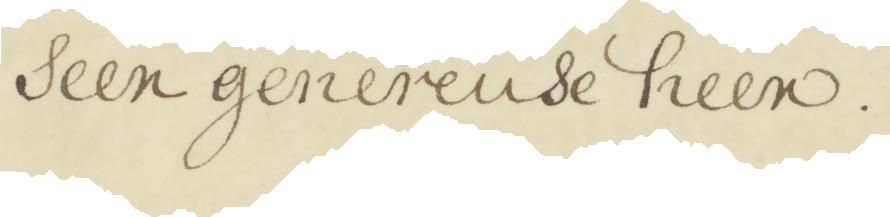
seer genereuse heer.
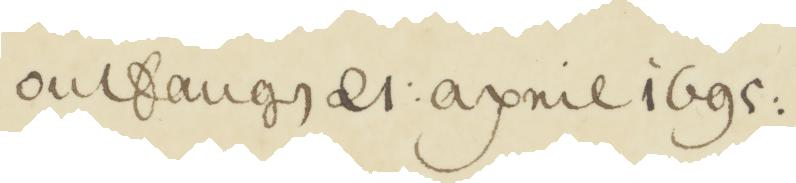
ontfangen 21: april 1695:
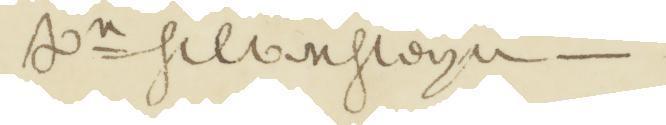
p=r silversteijn —
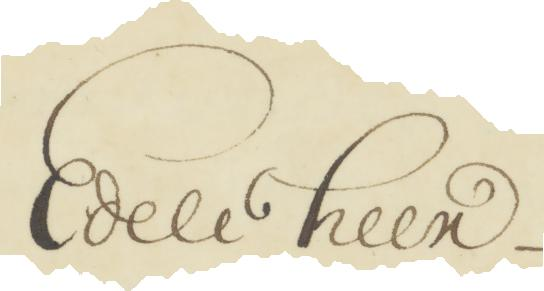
Edele heer
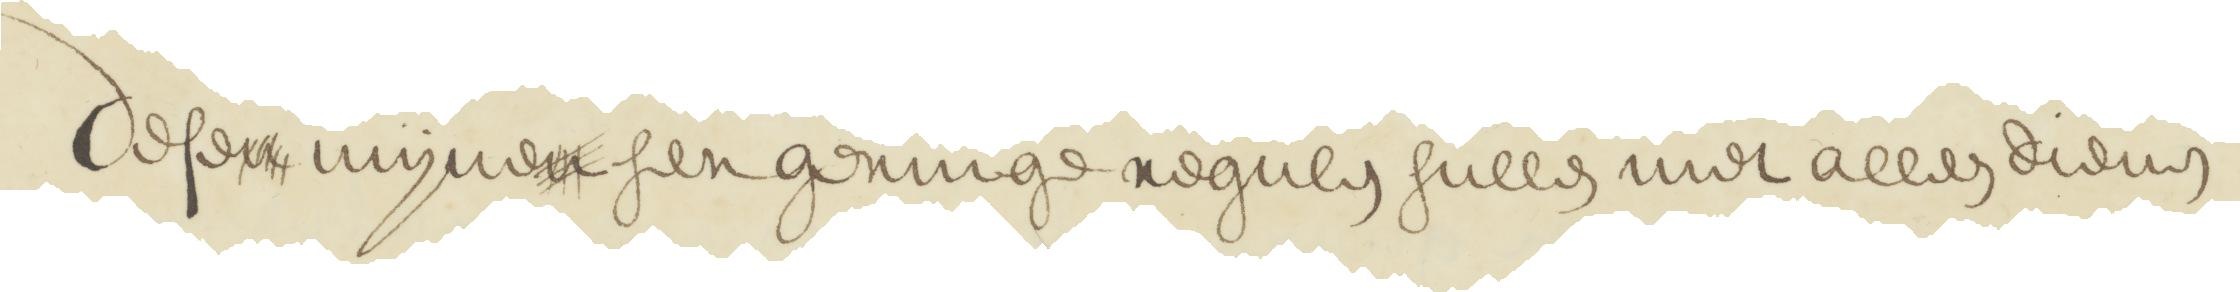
desen mijnen ser geringe regulen sullen niet alleen dienen
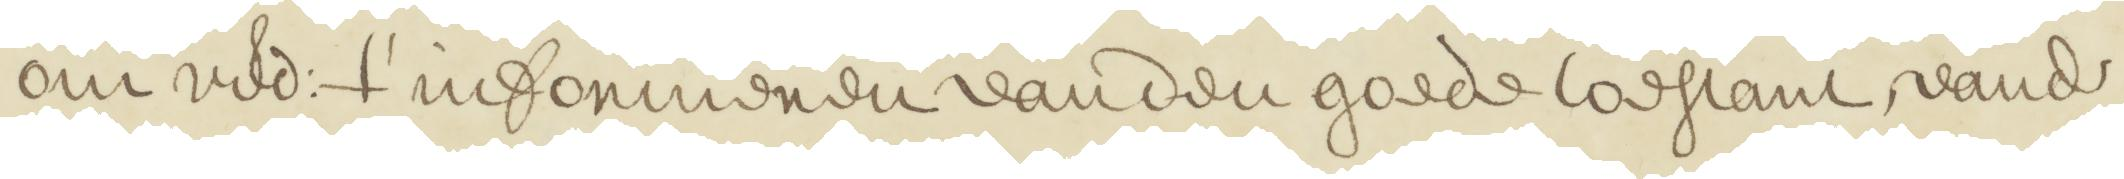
om vEd: t' informeren van den goede toestant, vande
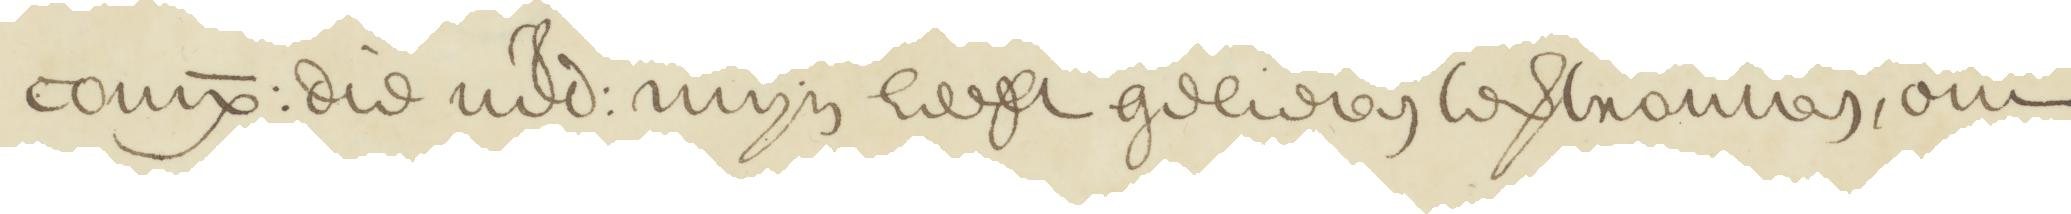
comp: die uEd: mijn heeft gelieven te vertrouwen, om
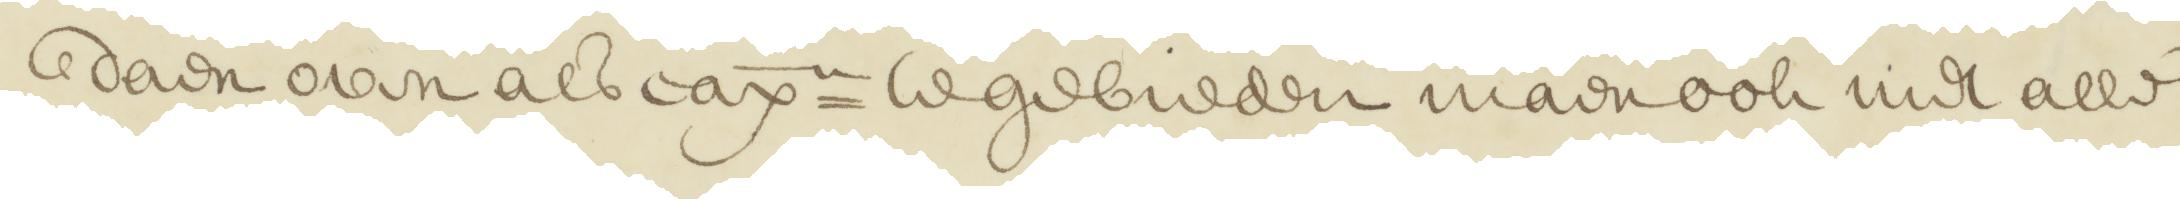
daer over als cap=n te gebieden maer ook met alle
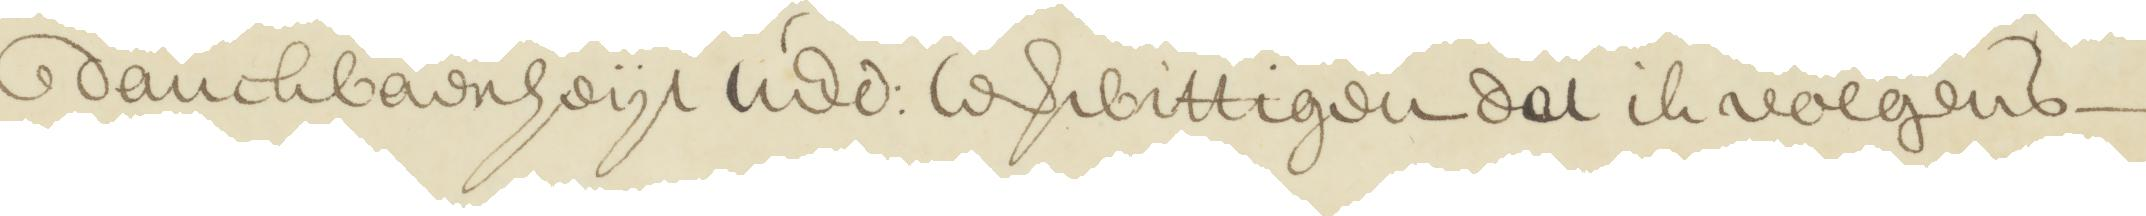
danckbaerheijt uEd: te verwittigen dat ik volgens —
